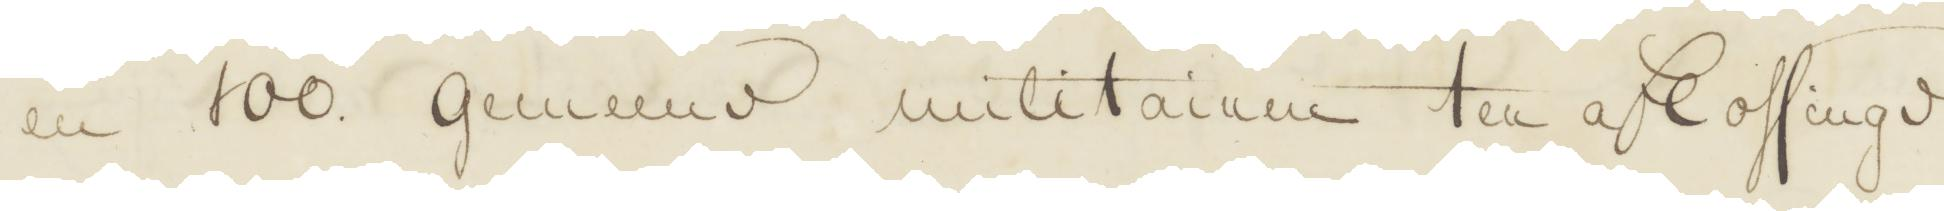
en 100. gemeene militairen ter aflossinge
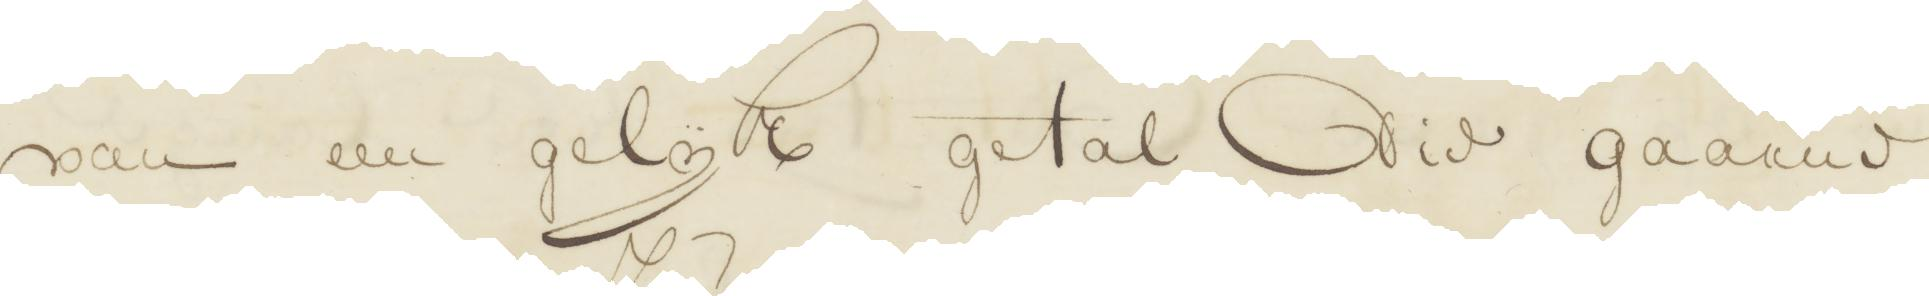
van een gelijk getal die gaarne
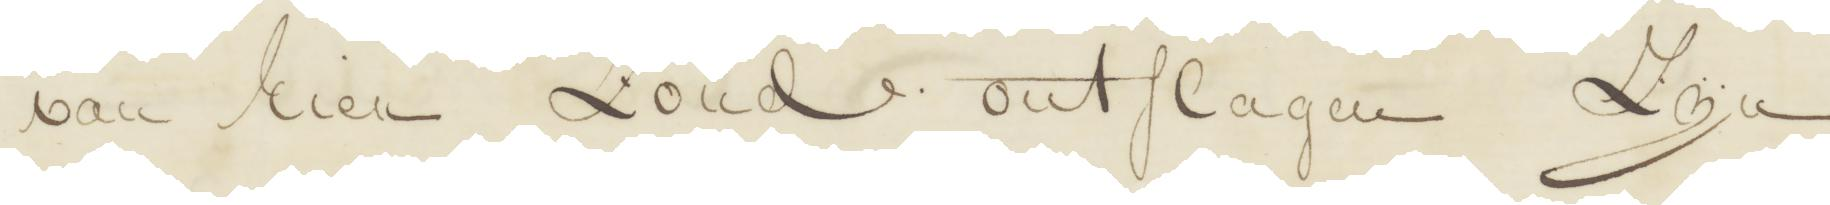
van hier zoude ontslagen zijn
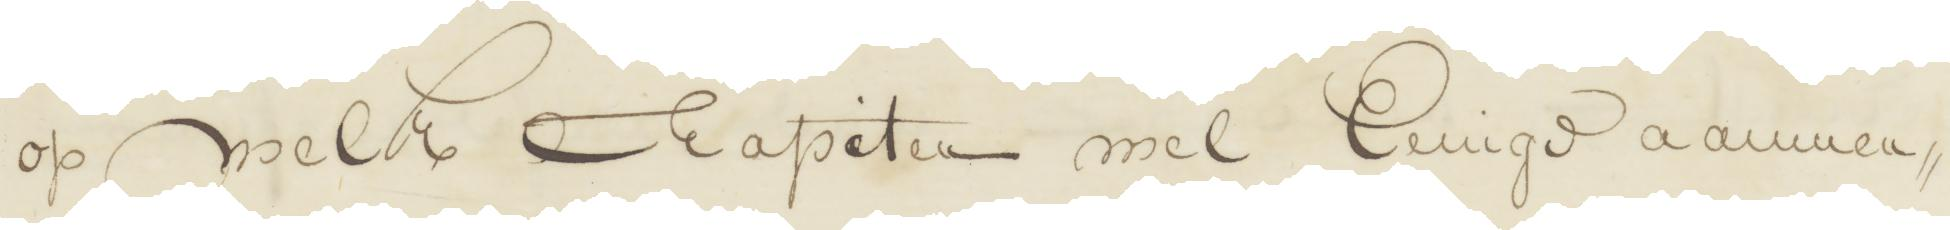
op welk chapiter wel Eenige aanmer„
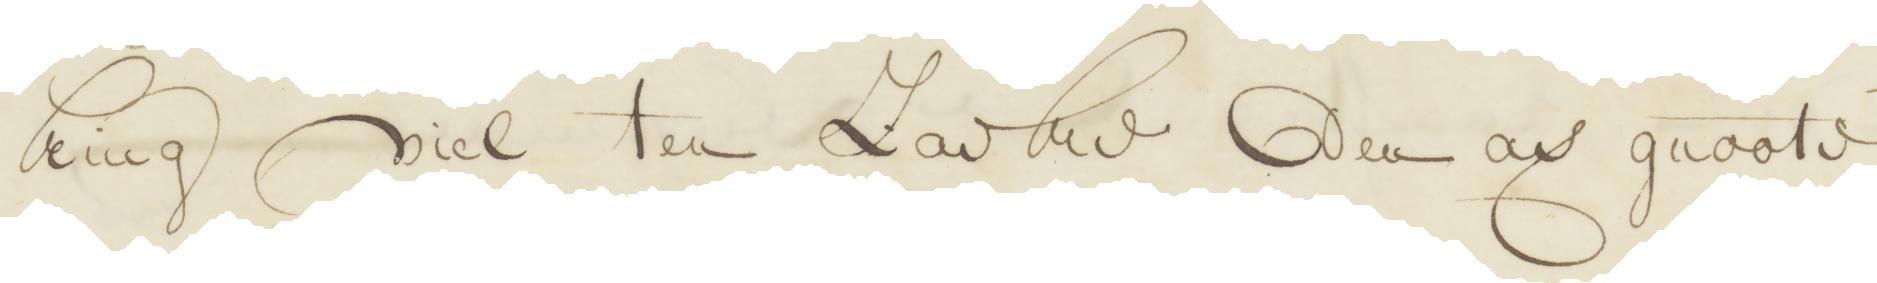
king viel ter zaeke der over groote
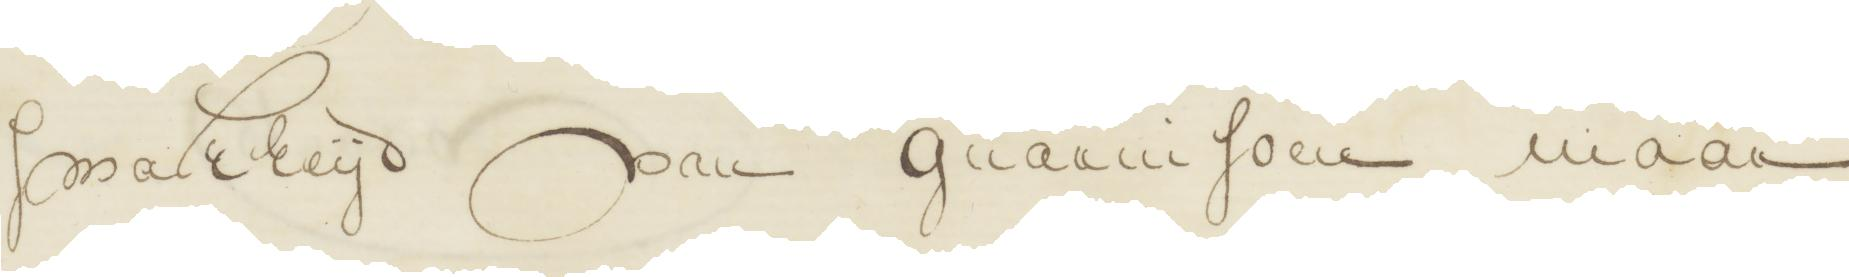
swakheijd van guarnisoen maar
